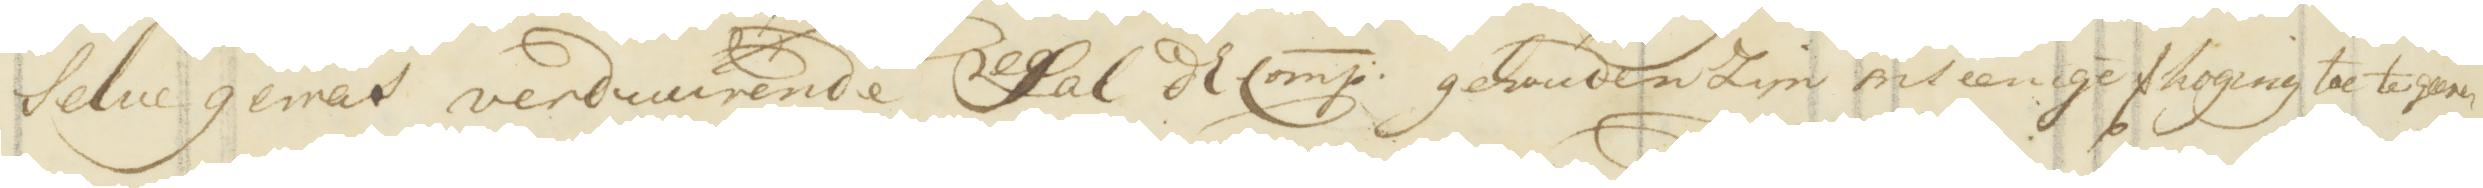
selve gewas verduurende sal dE Comp: gehouden zijn int eenige verhoging toe te geven
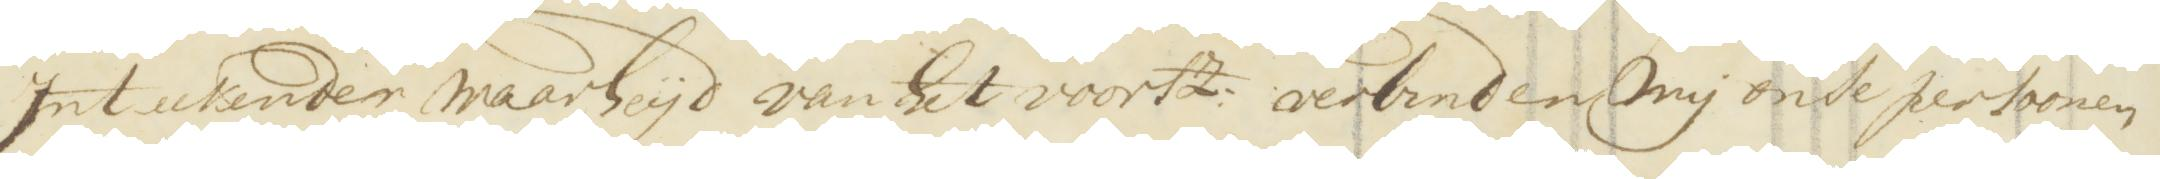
Inteekender waarheijd van het voorsz: verbinden wij onse persoonen
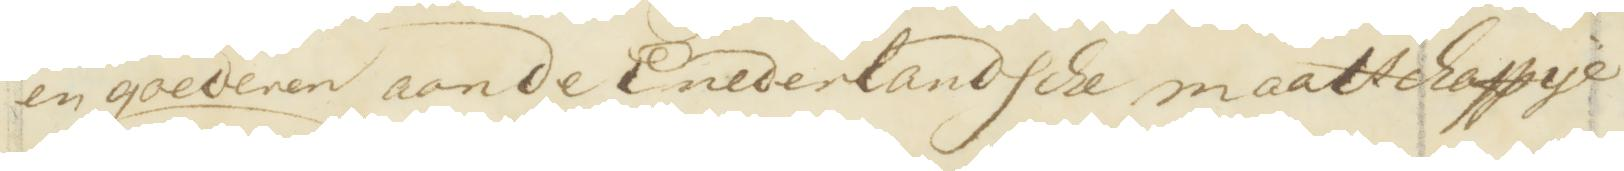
en goederen aan de E nederlandsche maatschappije
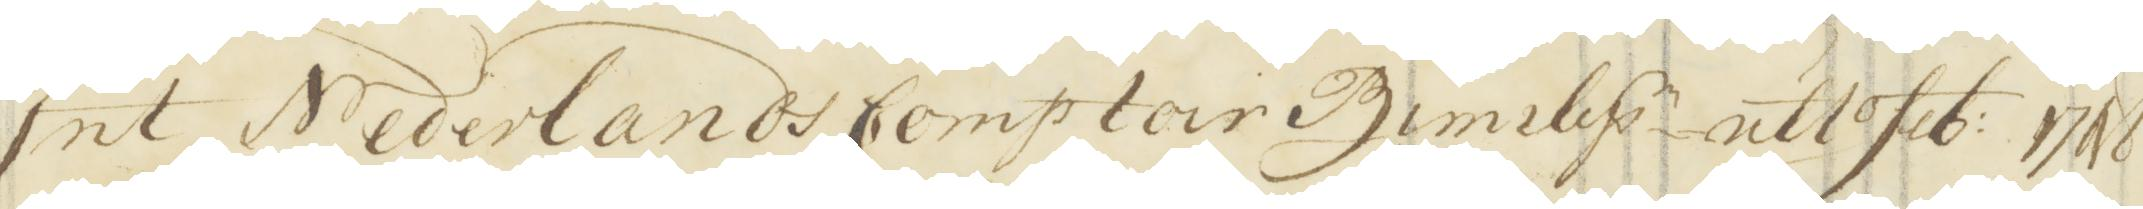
Jnt Nederlands Comptoir Bimilip=m ult.o feb: 1748
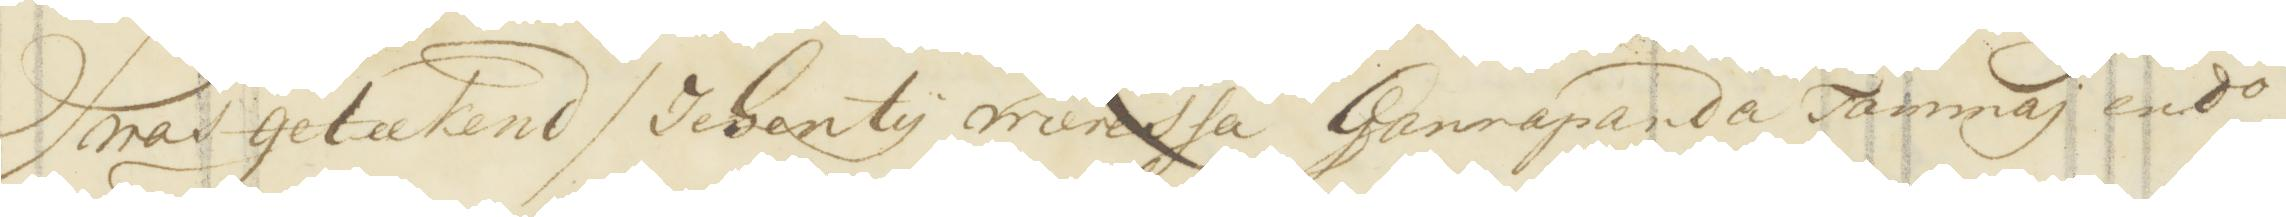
/was geteekend / Iehentij menssa Ganrapanda Tammaj end=o
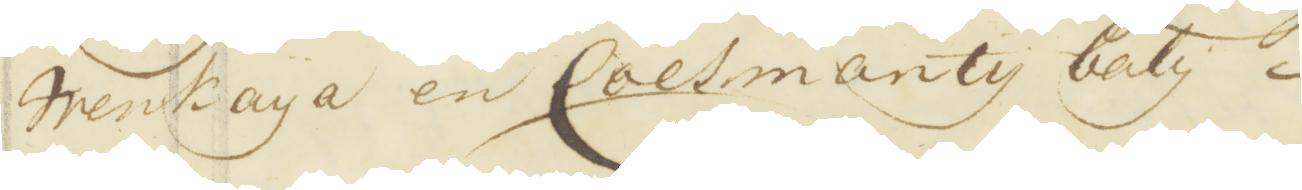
wenkaija en Coesmantij balij
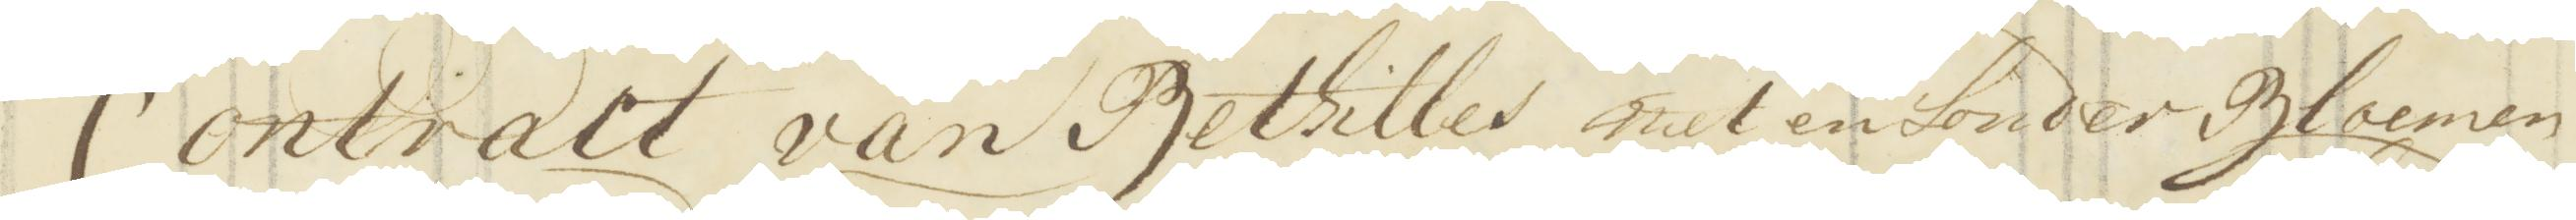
Contract van Bethilles niet en sonder Bloemen
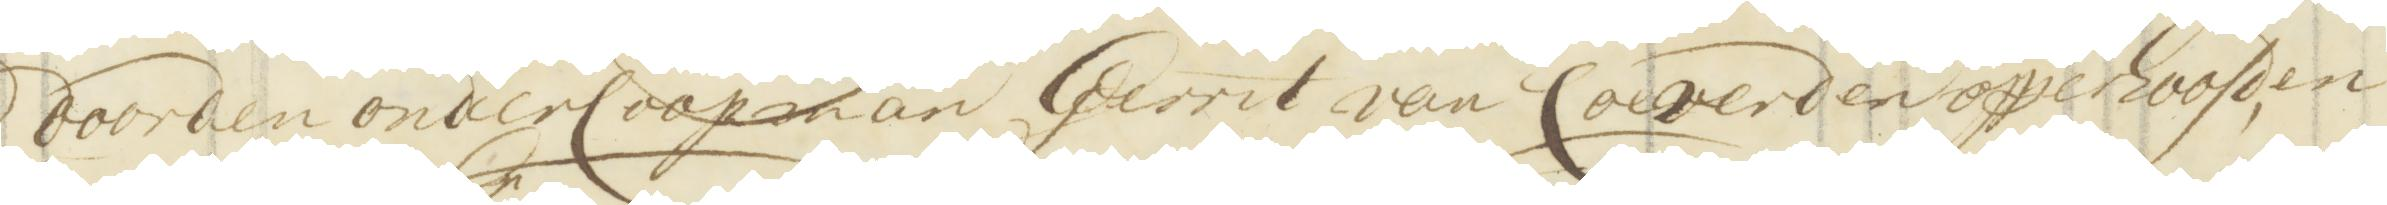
door den ondercoopman Gerrit van Coeverden opperhoofden
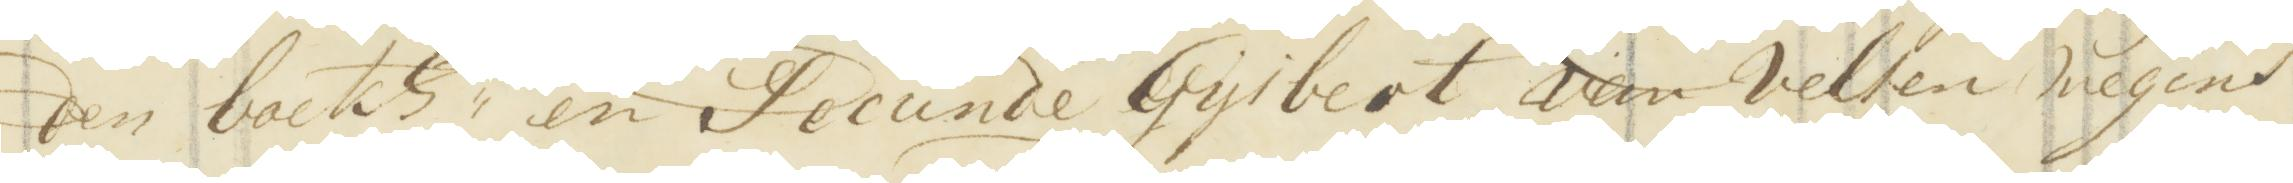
den boekh=r en Secunde Gijsbert van velsen wegens
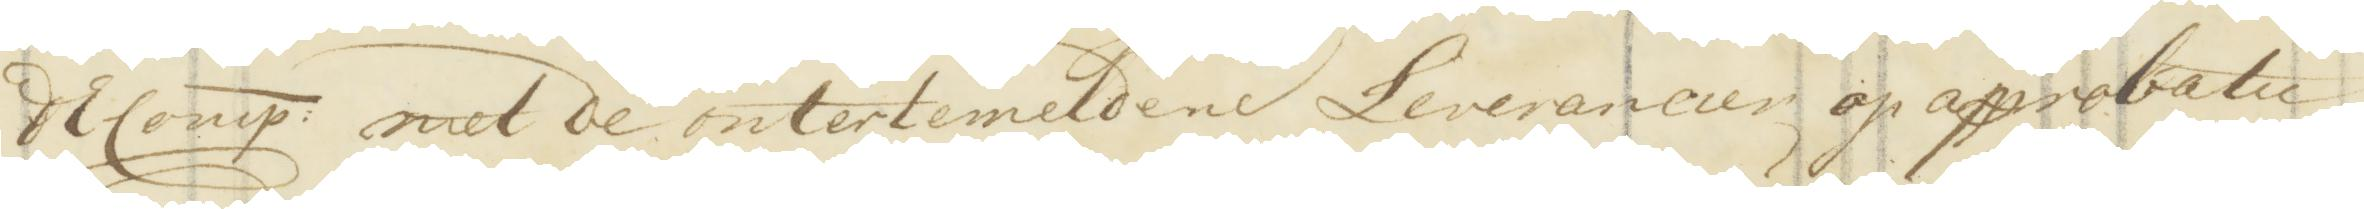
dE Comp: met de ontertemeldene Leverancien op approbatie
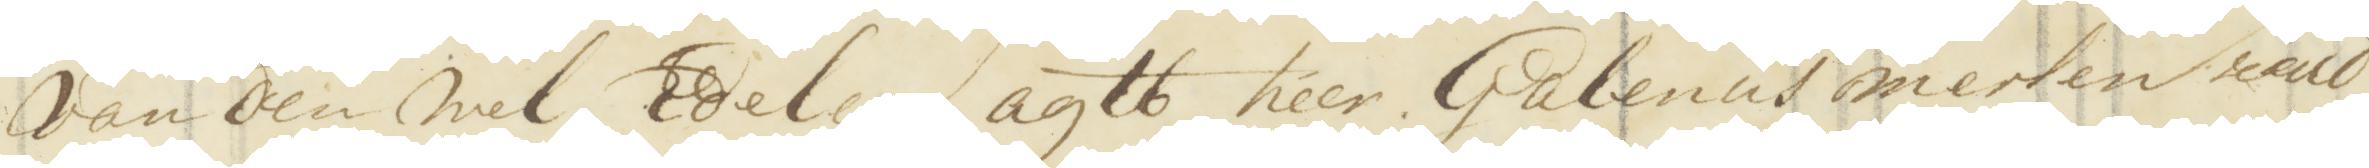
van den wel Edele agtb heer Gabenus mersen raad
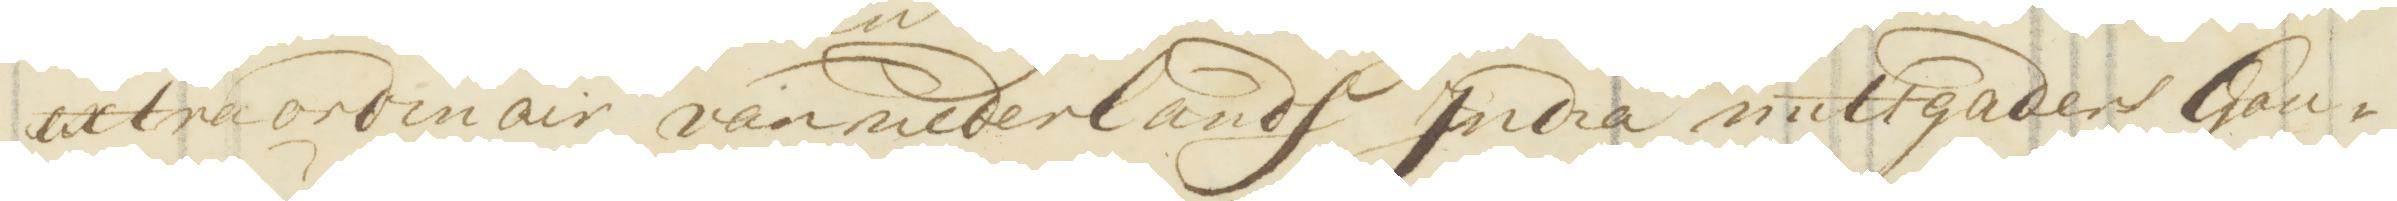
extra ordinair van nederlands Jndia mittgaders Gou„
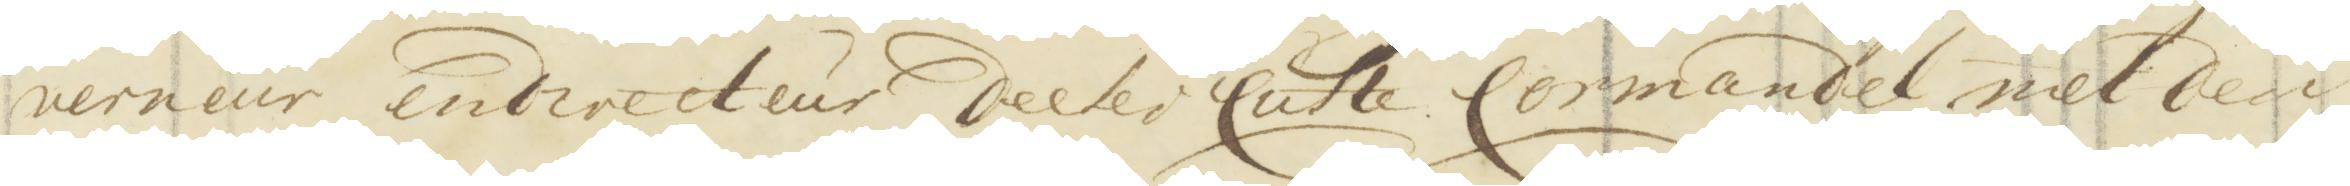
verneur en directeur deeser Custe Cormandel met den
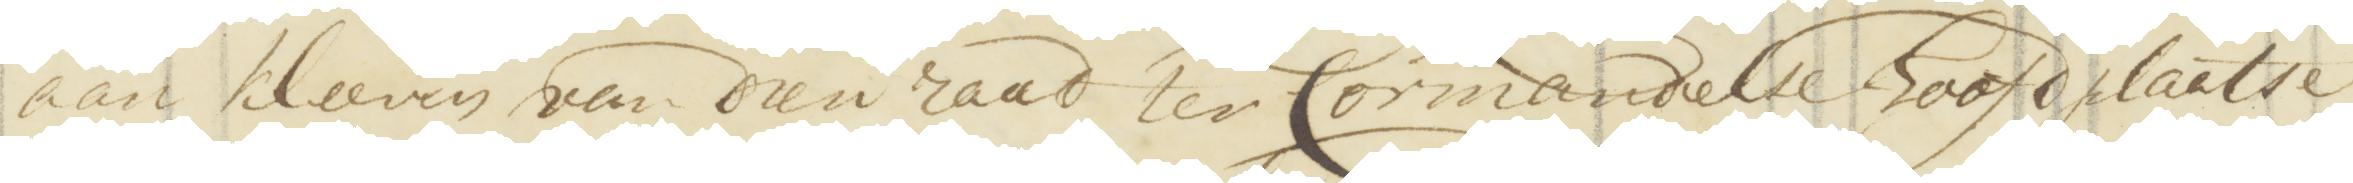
aan kleeven van dien raad ter Cormandelse hoofd plaatse
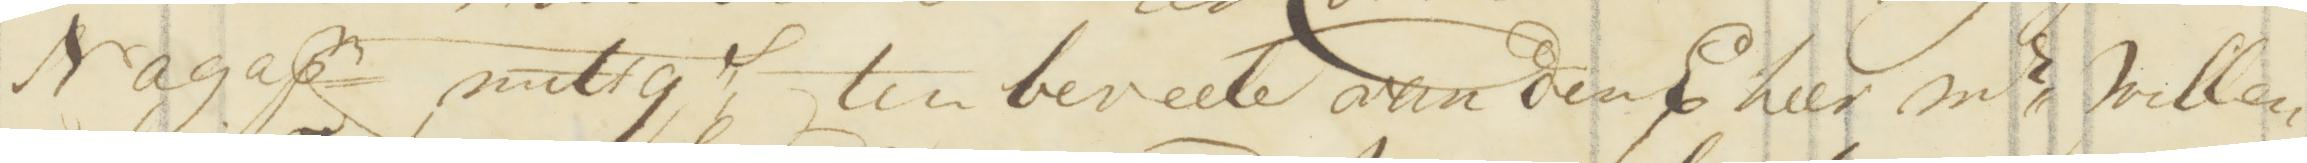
Nagap=m metig=s ten beveele van den E hier m=r Willem
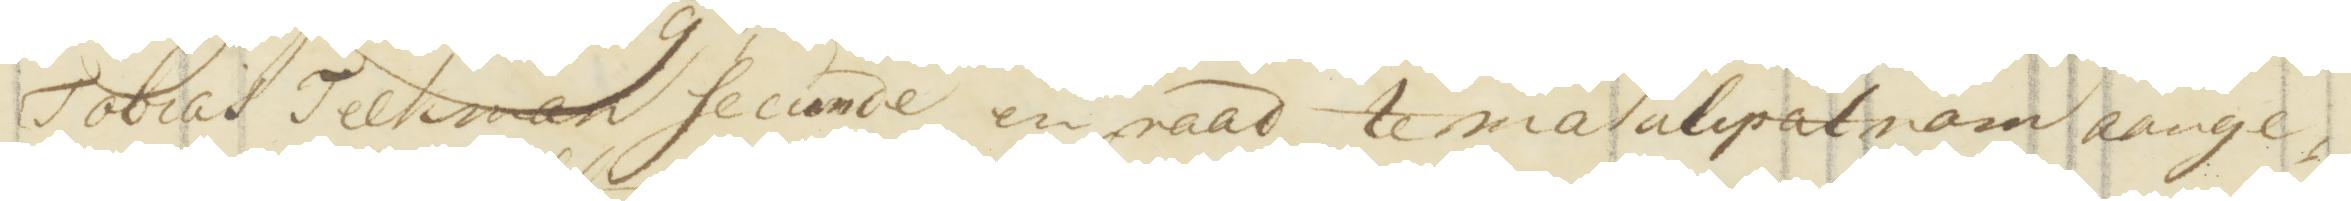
Tobias Teekman seciunde en raad te macalipatnam aange„
